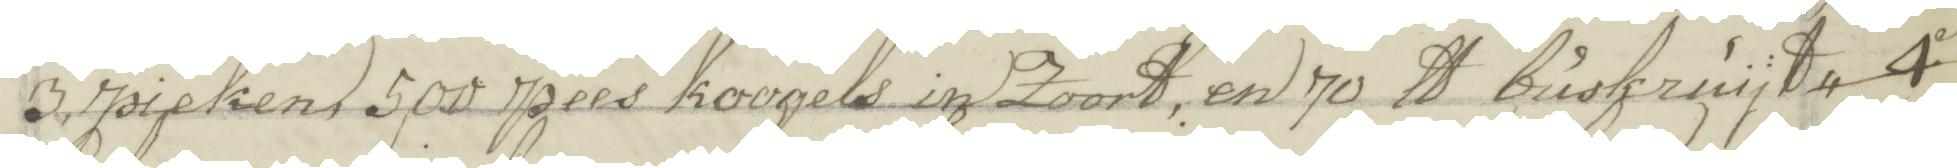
3. pieken 500 pees koogels in zoort, en 70 lb buskruijd „ 4e
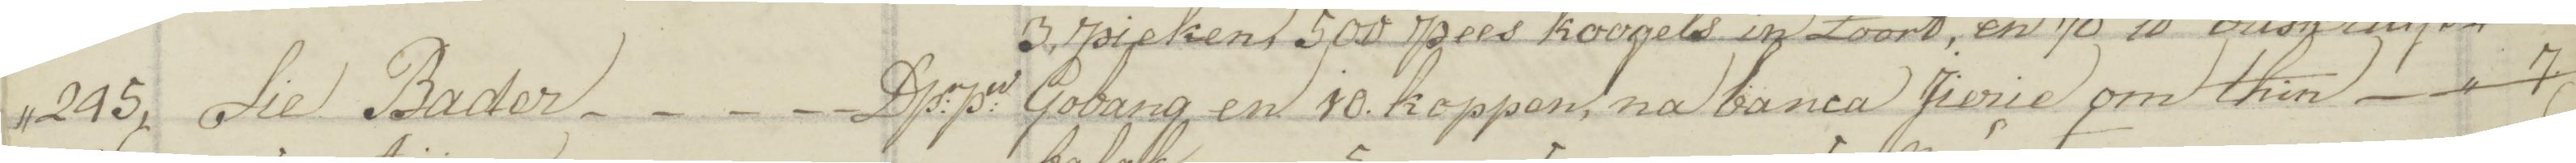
„ 245„ sie Bader - - - - - Dp:r p:w Gobang en 10. koppen, na banca Jierie om thin - - „ 7
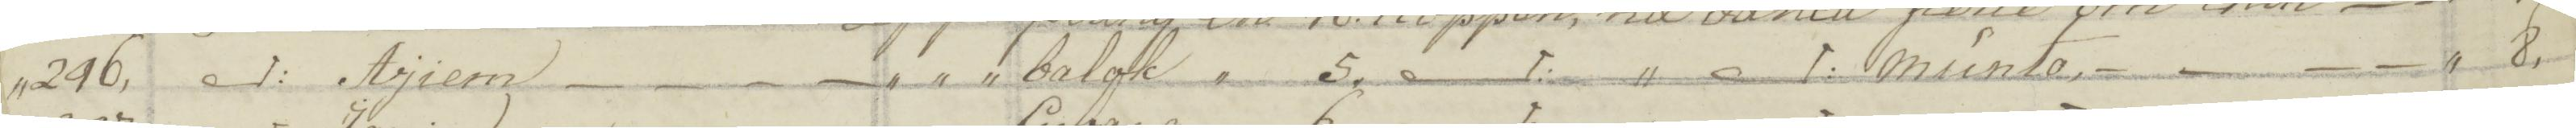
„ 246, _:o Ajiem - - - - „ „ „ balok „ 5, _:o „ _:o munto, - - - - „ 8,
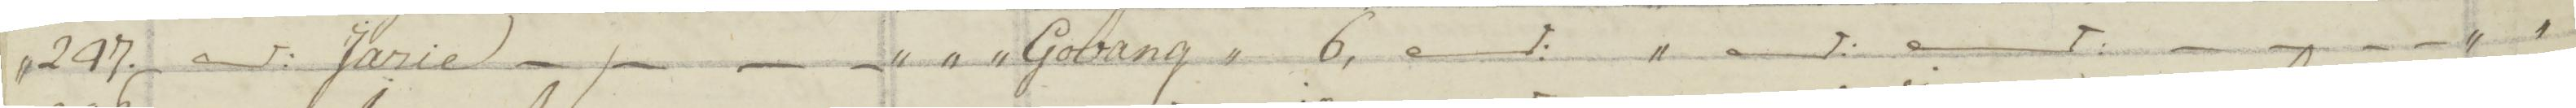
„ 247, _:o Jarie - - - - „ „ Gobang „ 6, _:o „ _:o - - - - „ 1
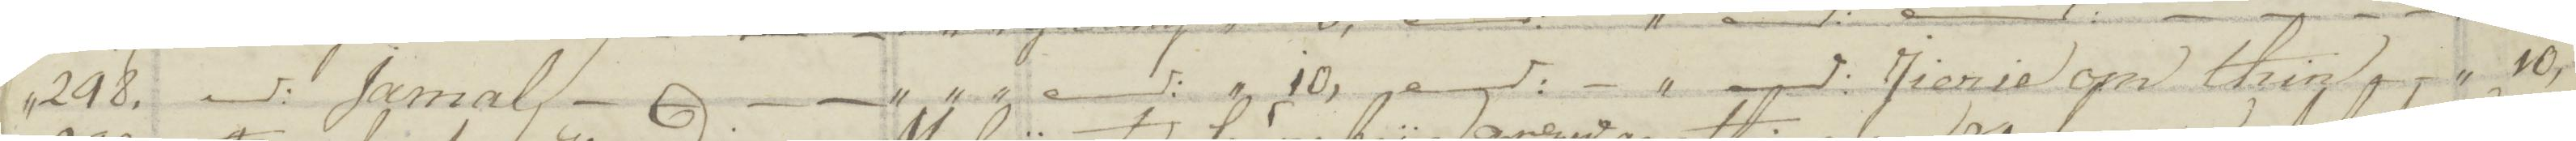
„ 248, _:o Jamal - - - - „ „ „ _:o „ 10, _:o - „ _:o Jierie om thin - - „ 10,
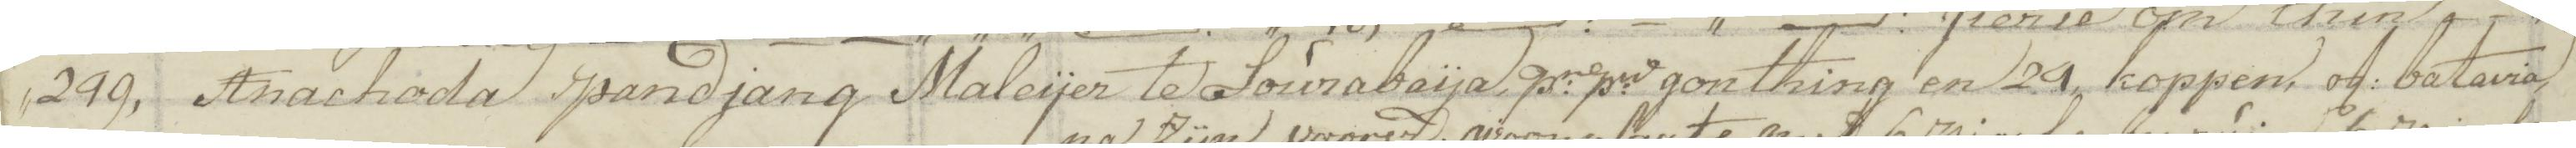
„ 249, Anachoda pandjang Maleijer te Sourabaija p:r p:w gonthing en 24, koppen, over batavia
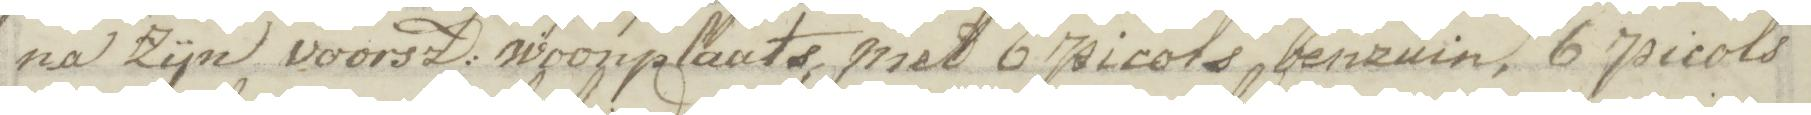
na zijn voorsz: woonplaats met 6 picols, benzuin, 6 Picols
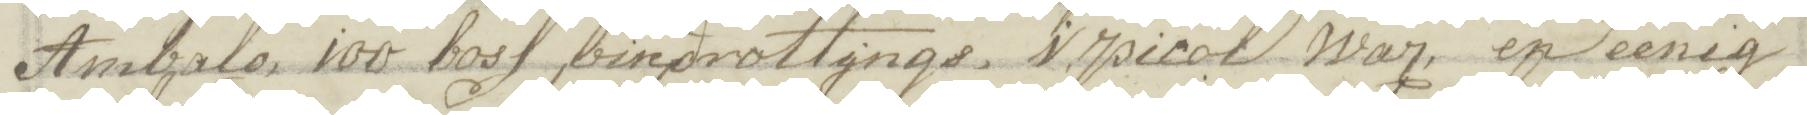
Ambalo, 100 boss bindrottings, 1 picol wax, en eenig
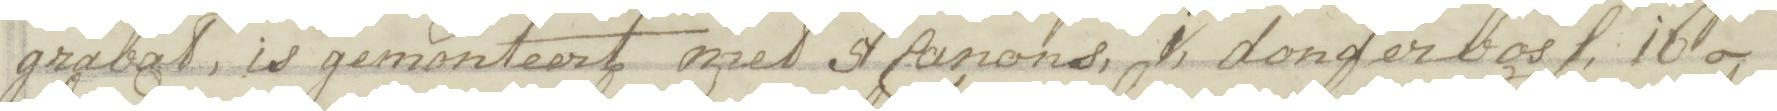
grabat, is gemonteert met 5 Canons, 1, donder boss, 16 -
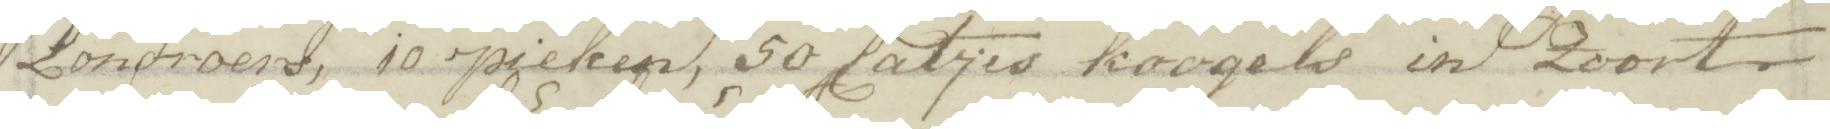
Londroers, 10 pieken, 50 Catjes koogels in zoort
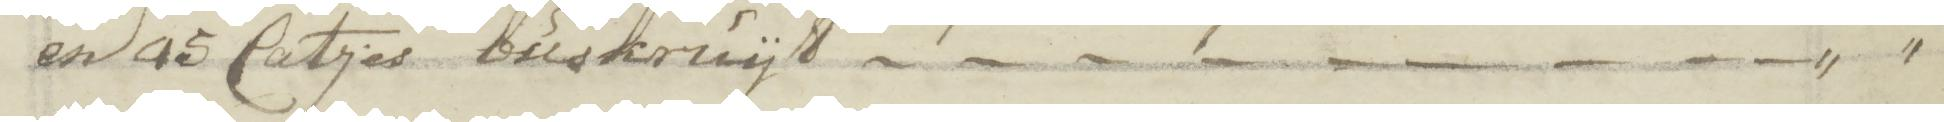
en 45 Catjes buskruijt - - - - - - - - - „ „
